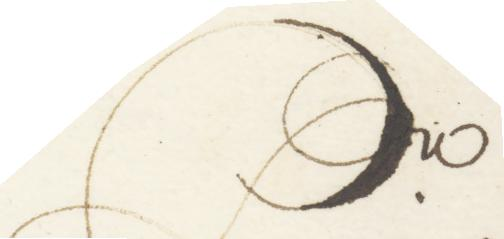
P:r
